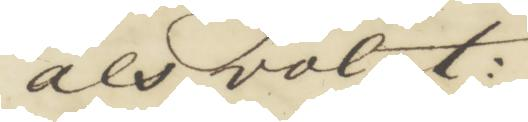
als volgt:
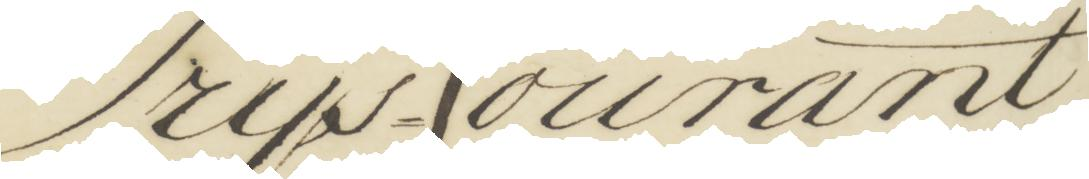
Prijs=Courant
